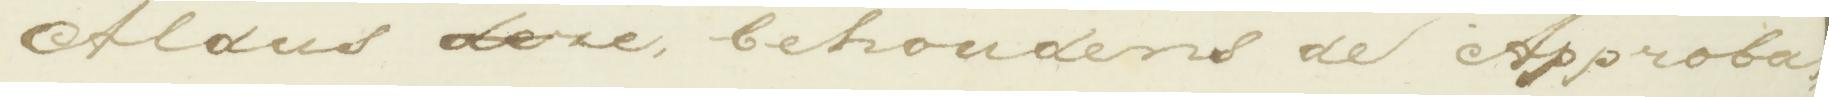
Aldus deze, behoudens de Approba„
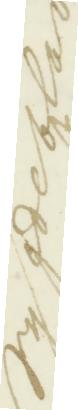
Vyfde blad
